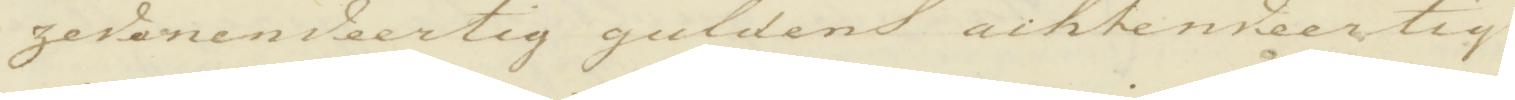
zevenen Veertig guldens acht en Veertig
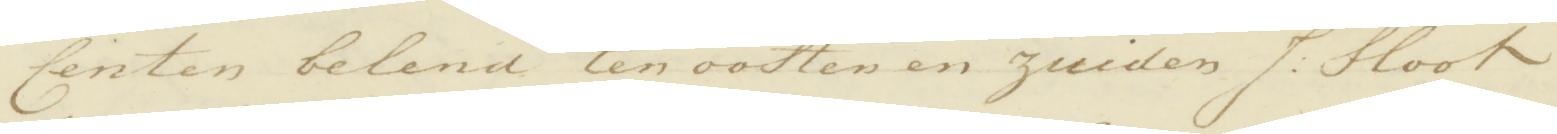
Centen belend ten oosten en zuiden J: Sloot
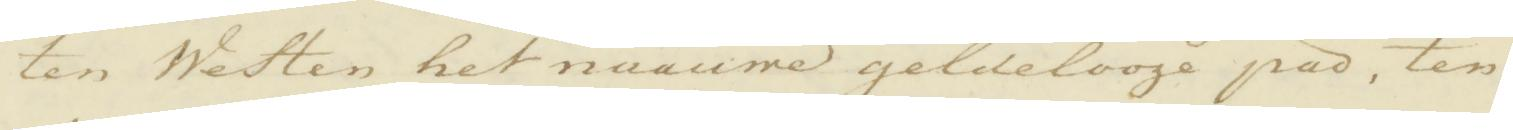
ten Westen het naauwe geldelooze pad, ten
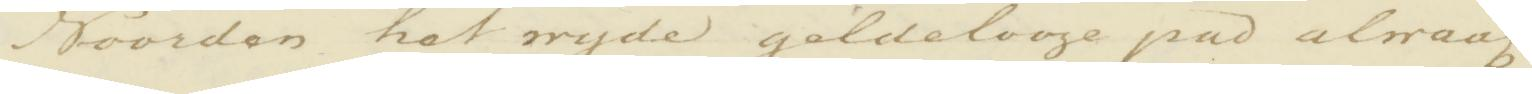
Noorden het wyde geldelooze pad alwaar
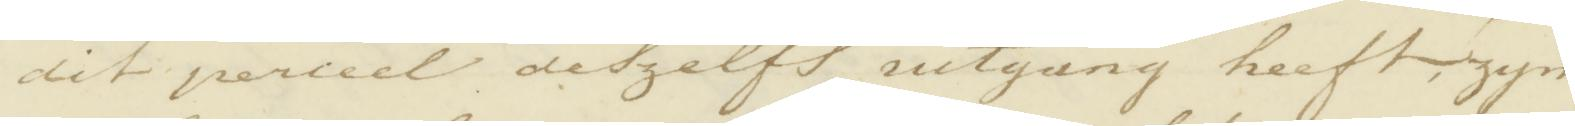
dit perceel deszelfs uitgang heeft, zyn
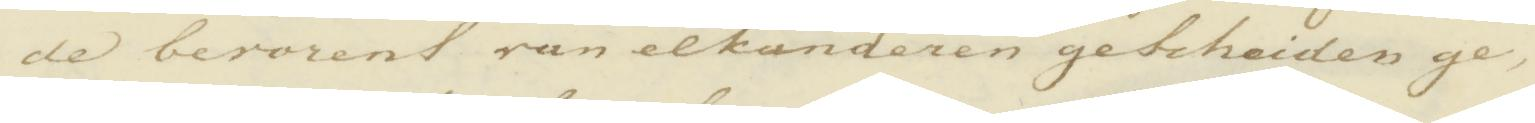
de bevorens van elkanderen gescheiden ge„
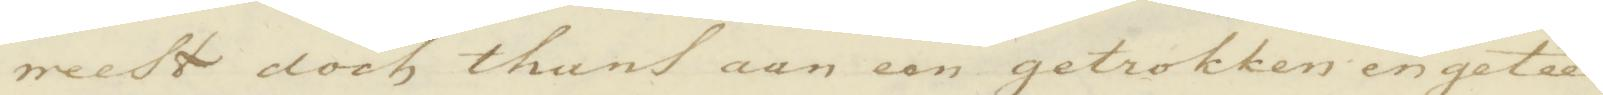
weest doch thans aan een getrokken en getee
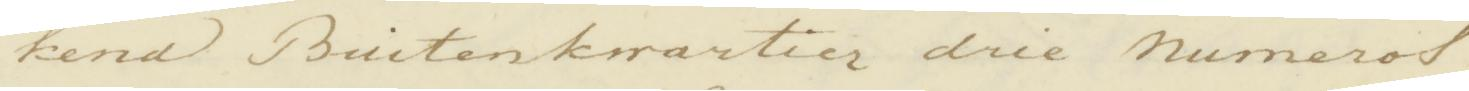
kend Buitenkwartien drie Numeros
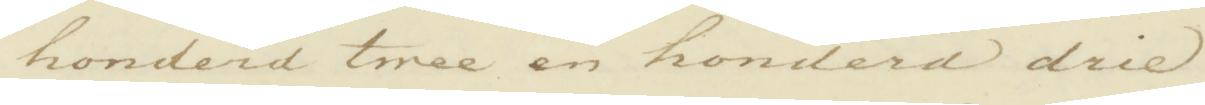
honderd twee en honderd drie
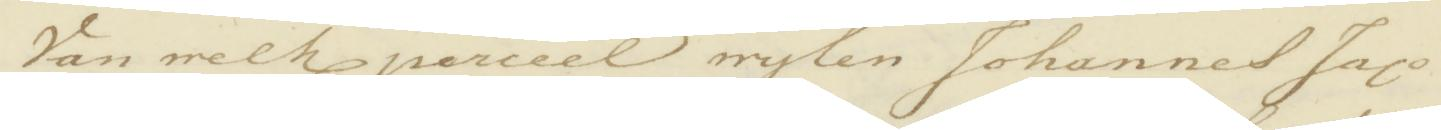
Van welk perceel wylen Johannes Jaco
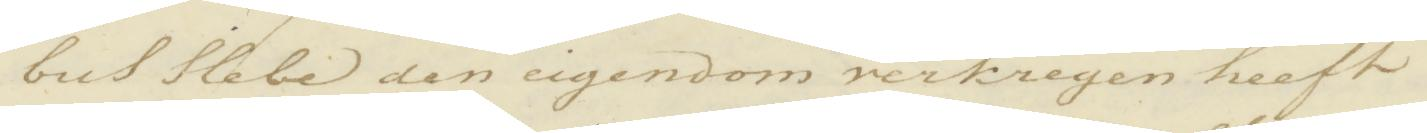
bus Slebe den eigendom verkregen heeft
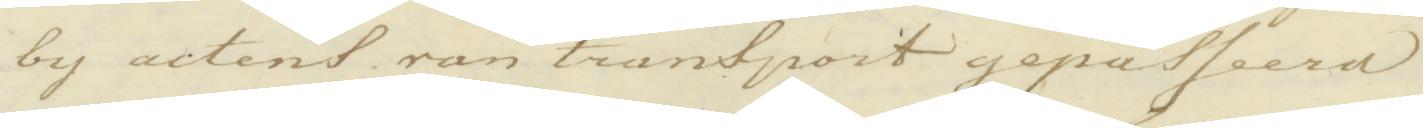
by actens van transport gepasseerd
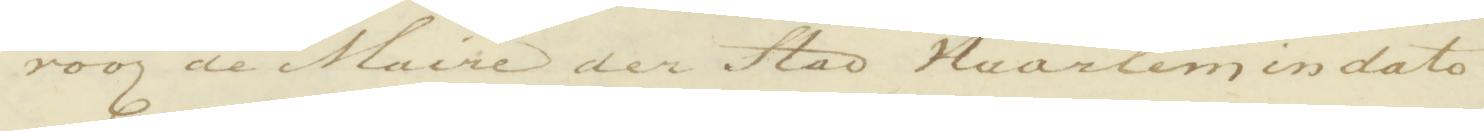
voor de Maire der Stad Haarlem in dato
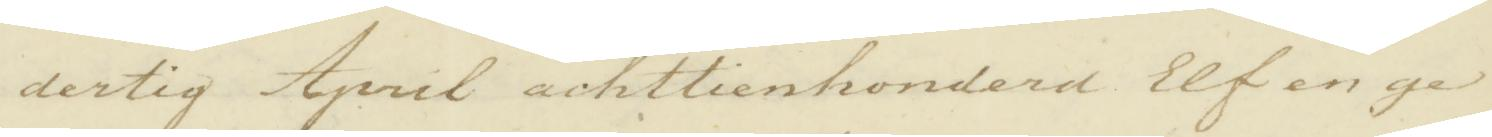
dertig April achttien honderd Elf en ge
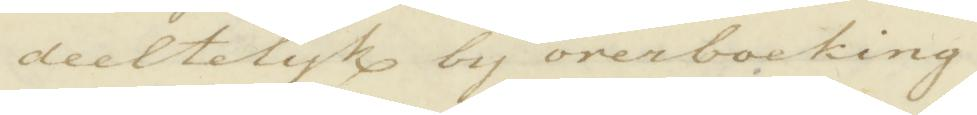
deeltelyk by overboeking
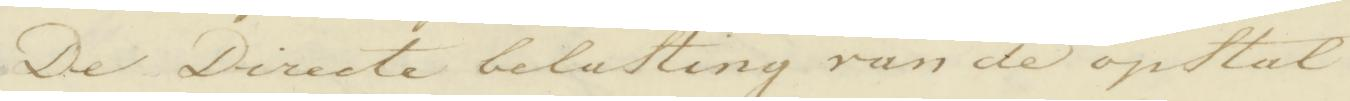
De Directe belasting van de opstal
